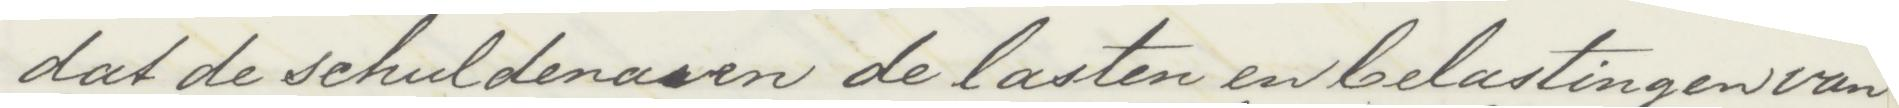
dat de schuldenaren de lasten en belastingen van
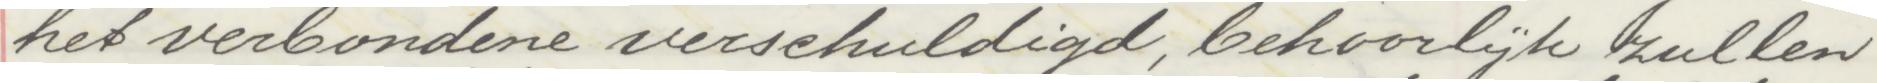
het verbondene verschuldigd, behoorlijk zullen
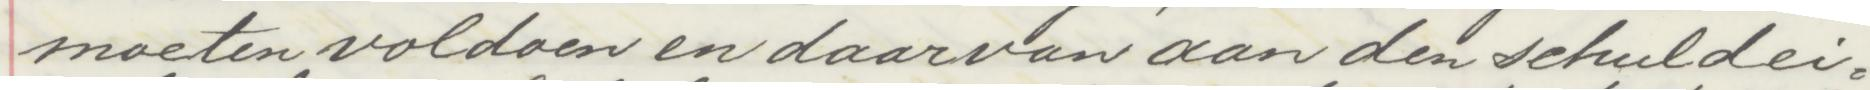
moeten voldoen en daarvan aan den schuldei=
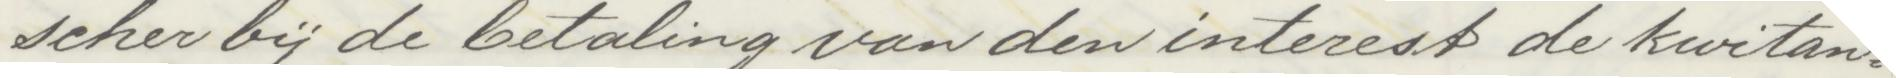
scher bij de betaling van den interest de kwitan=
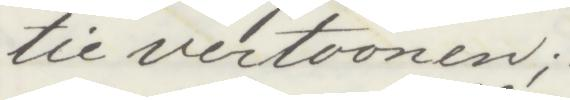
tie vertoonen;
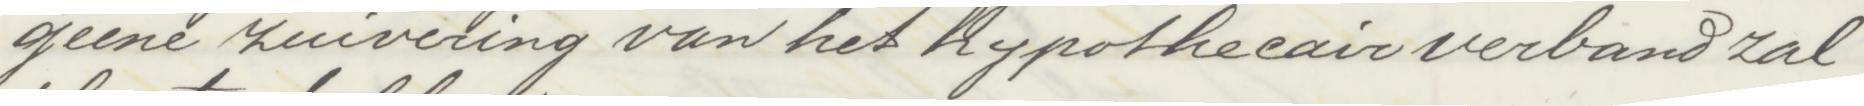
geene zuivering van het hypothecair verband zal
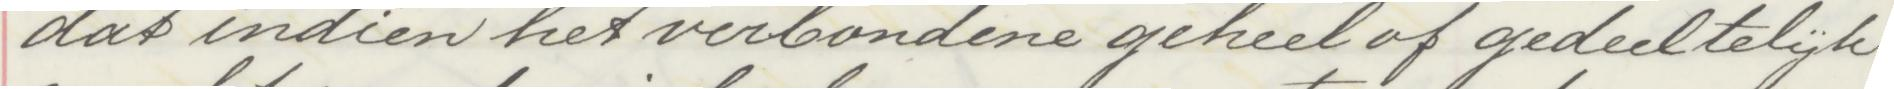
dat indien het verbondene geheel of gedeeltelijk
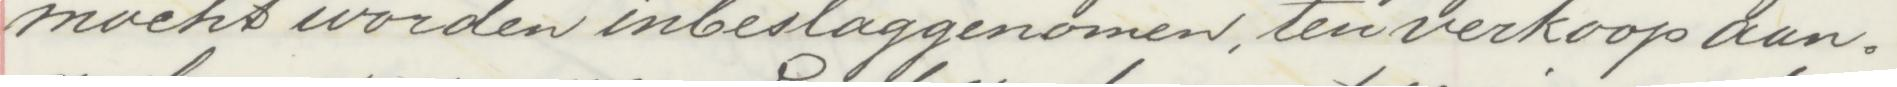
mocht worden inbeslaggenomen, ten verkoop aan=
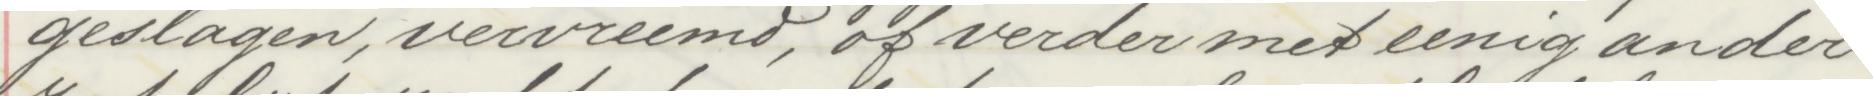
geslagen, vervreemd, of verder met eenig ander
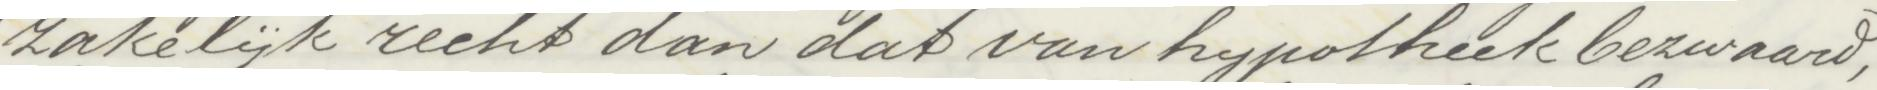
zakelijk recht dan dat van hypotheek bezwaard,
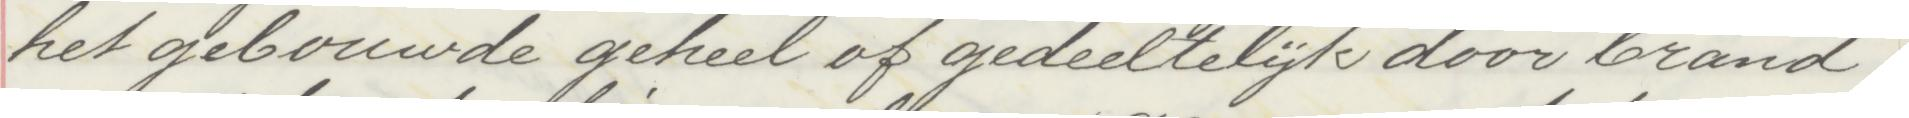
het gebouwde geheel of gedeeltelijk door brand
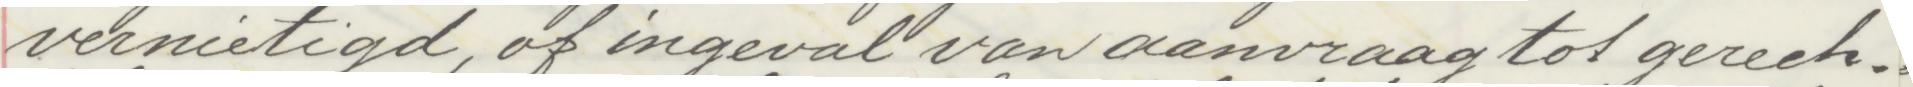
vernietigd, of ingeval van aanvraag tot gerech=
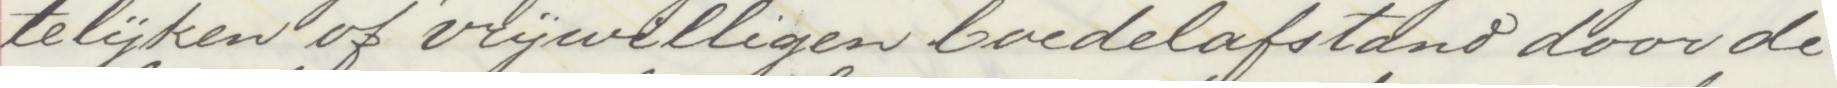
telijken of vrijwilligen boedelafstand door de
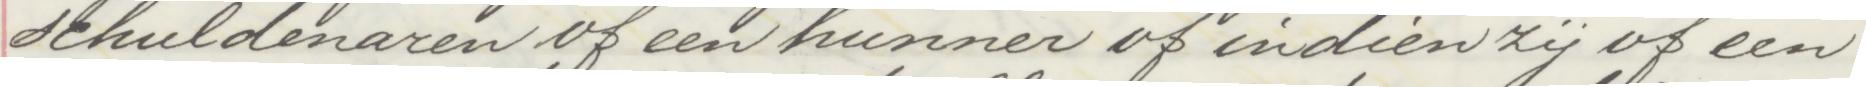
schuldenaren of een hunner of indien zij of een
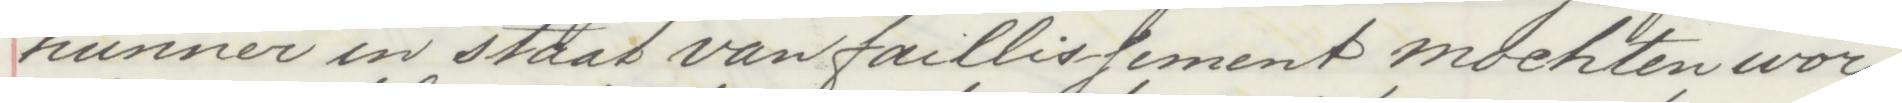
hunner in staat van faillissement mochten wor=
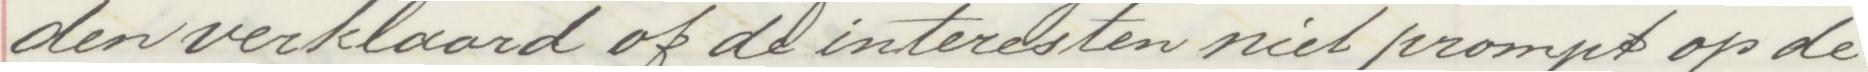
den verklaard of de interesten niet prompt op de
